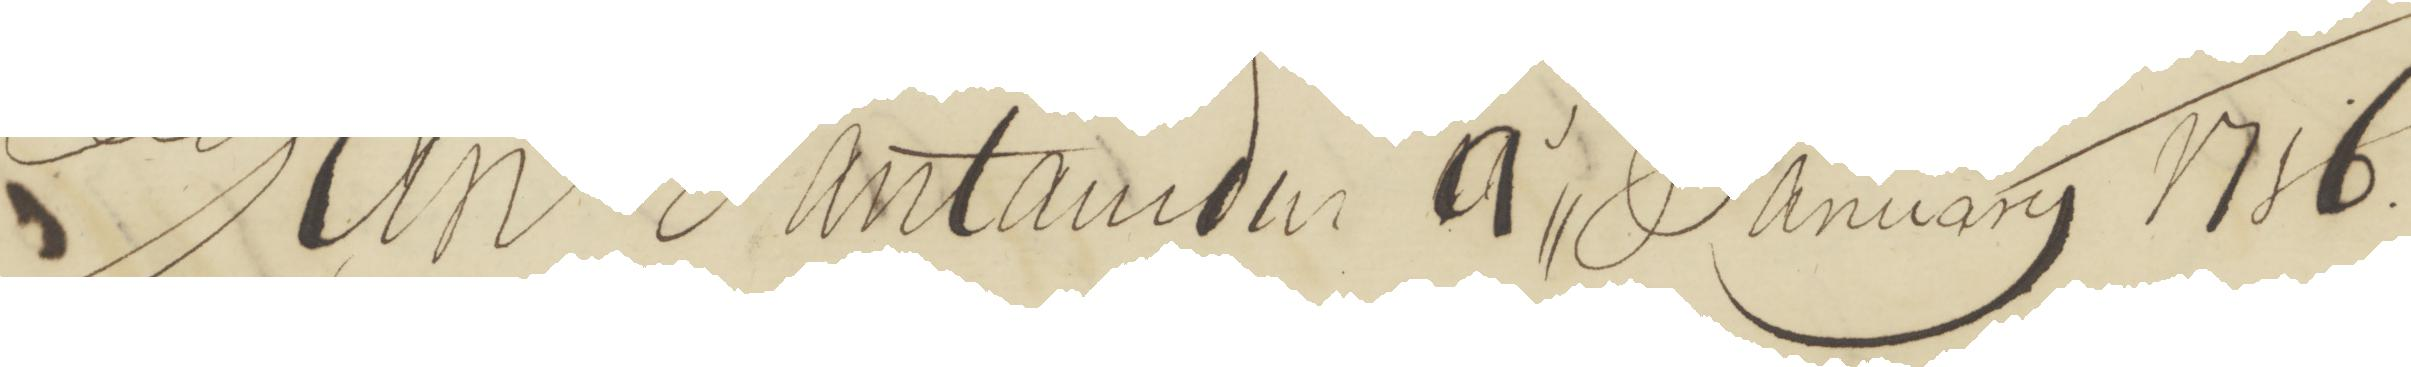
Van Bantam den 4„' Januarij 1716.
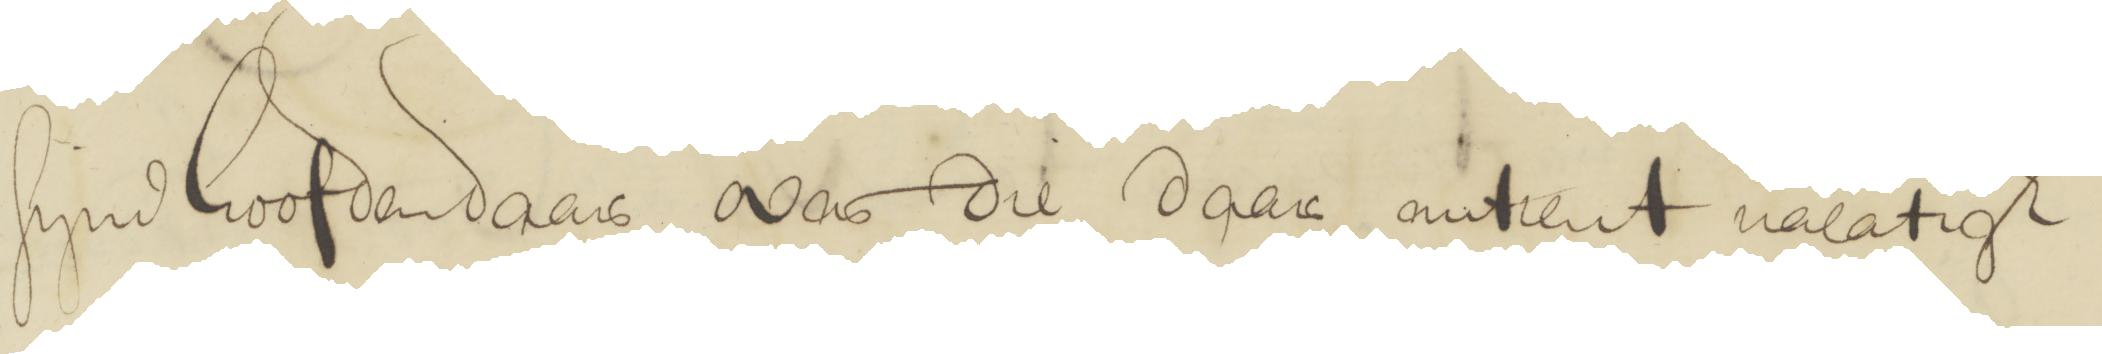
sijne hoofden daar over die daar omtrent nalatigh
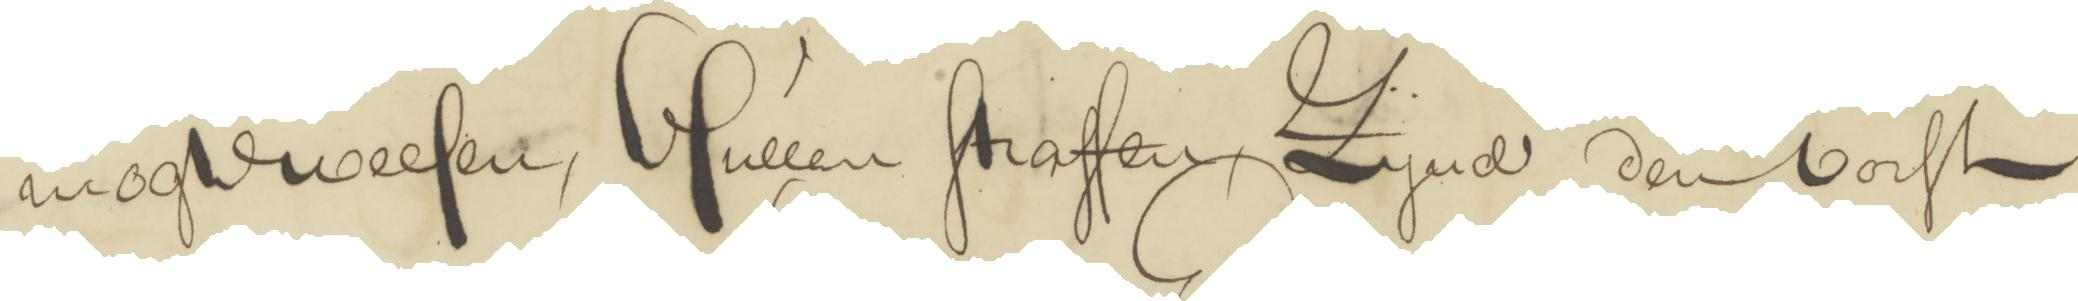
mogte weesen, te sullen straffen, zijnde den vorst
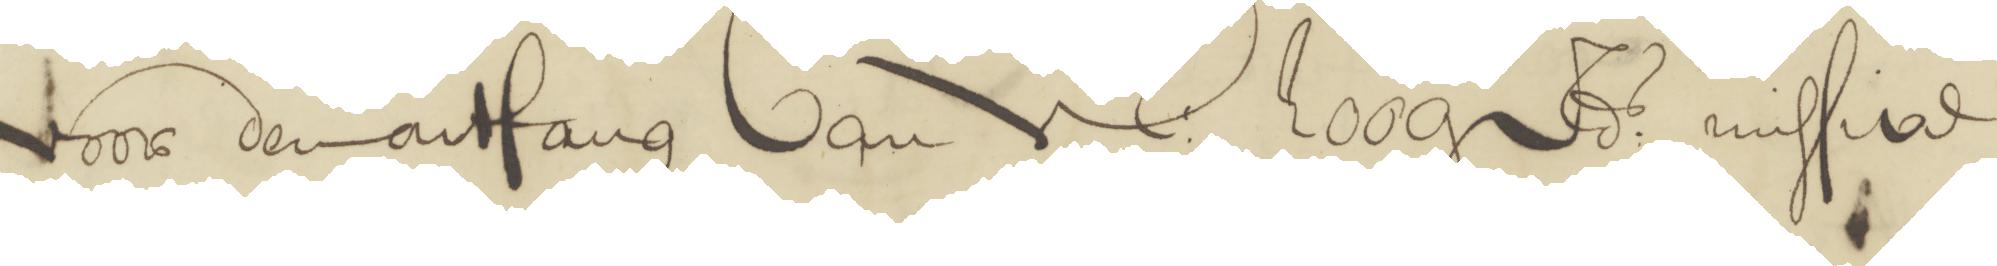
voor den ontfang van UE: hoog Ed:s missive
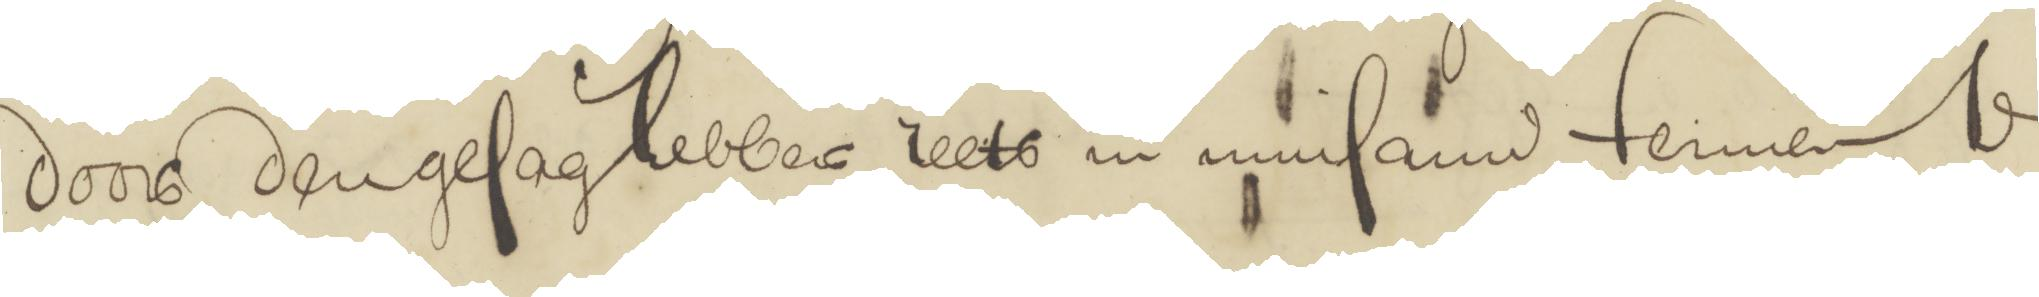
door den gesaghebber reets in minsame termen te
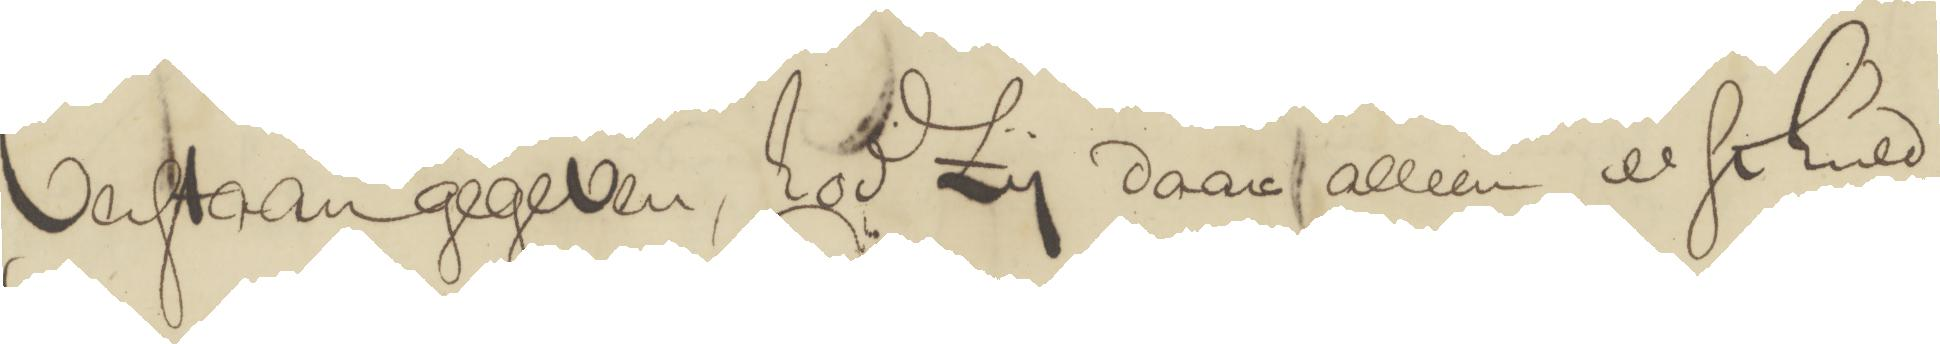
verstaan gegeven, hoe zij daar alleen de schuld
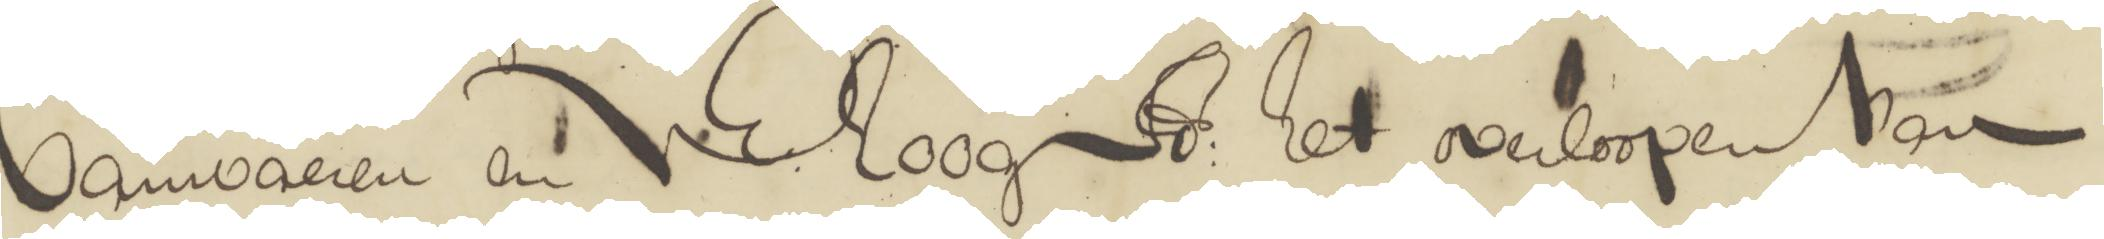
vanwaeren en UE: hoog Ed:s het overloopen van
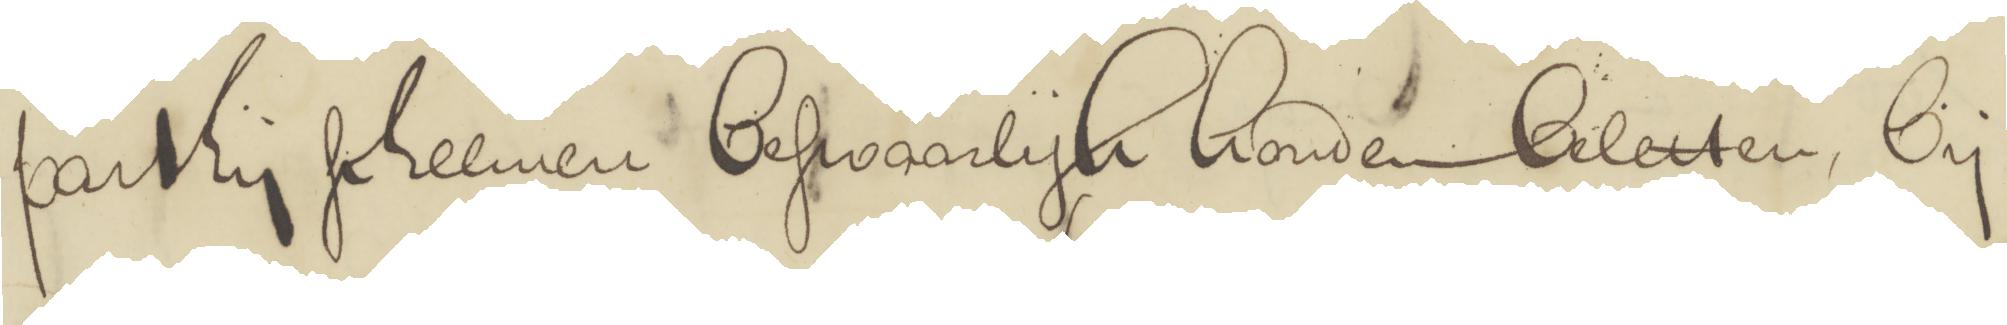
parthij schelmen beswaarlijk konden beletten, bij
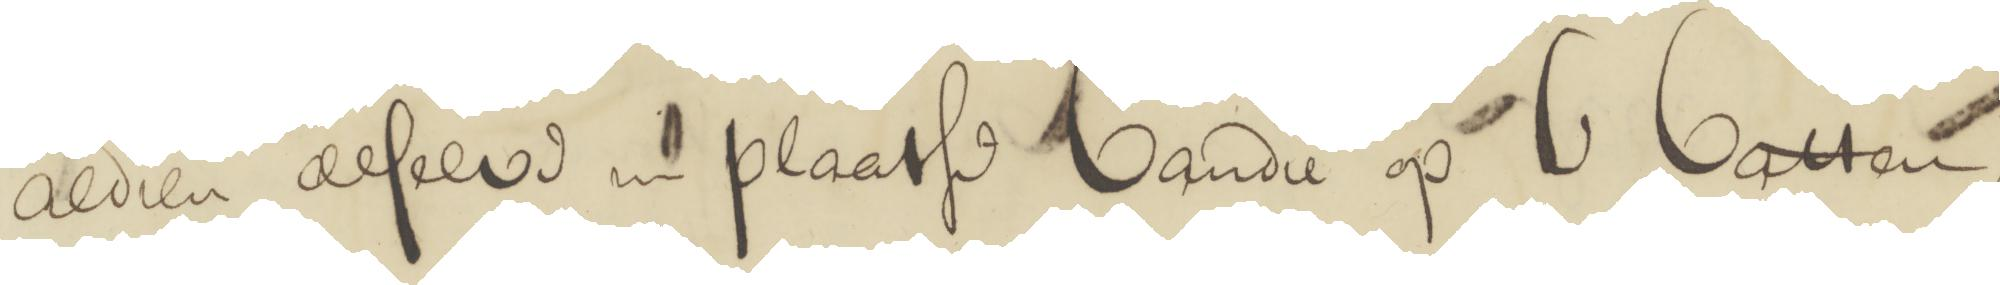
aldien deselve in plaatse vandie op te vatten
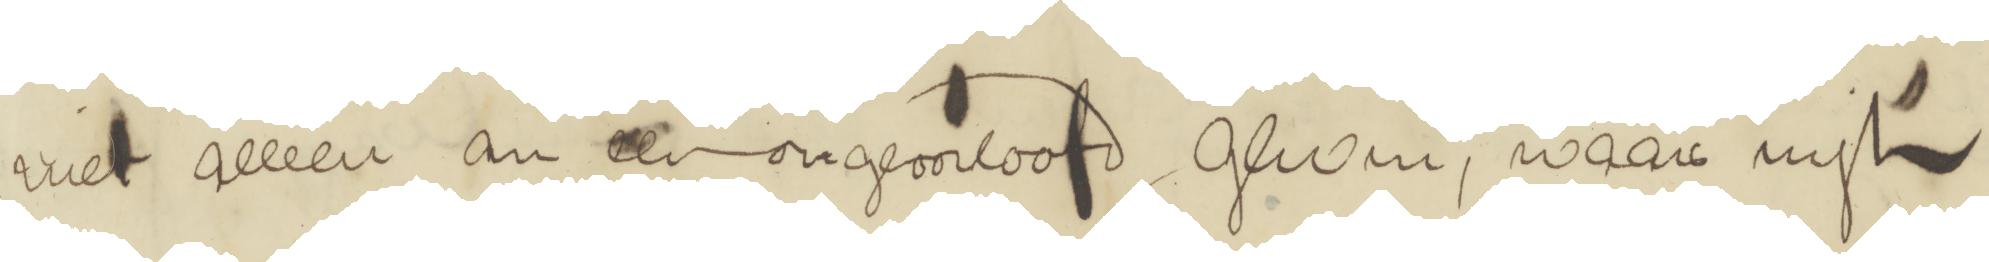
niet alleen an een ongeoorloofd gewin, waar uijt
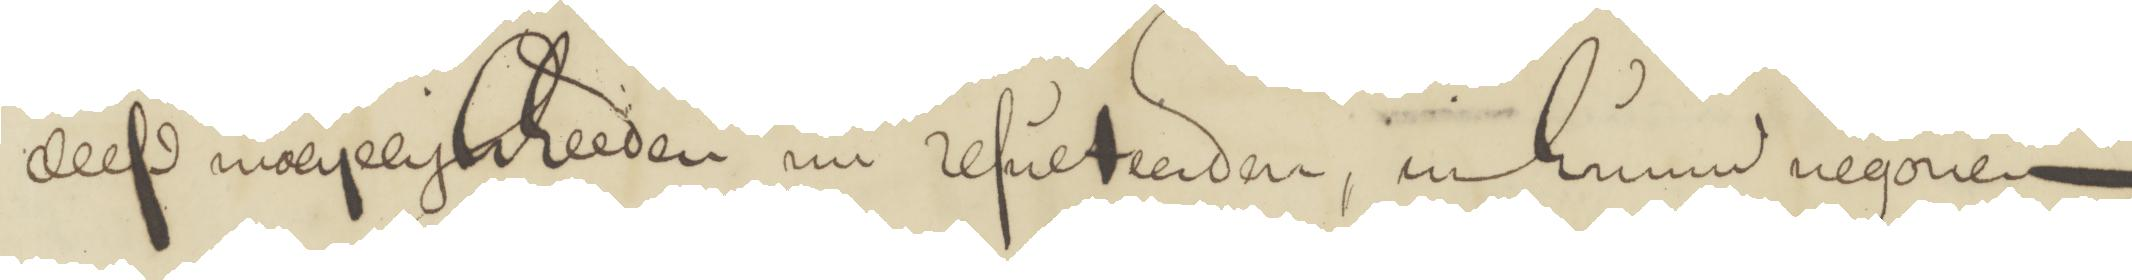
deese moeijelijkheeden nu resulteerden, in hunne negorien
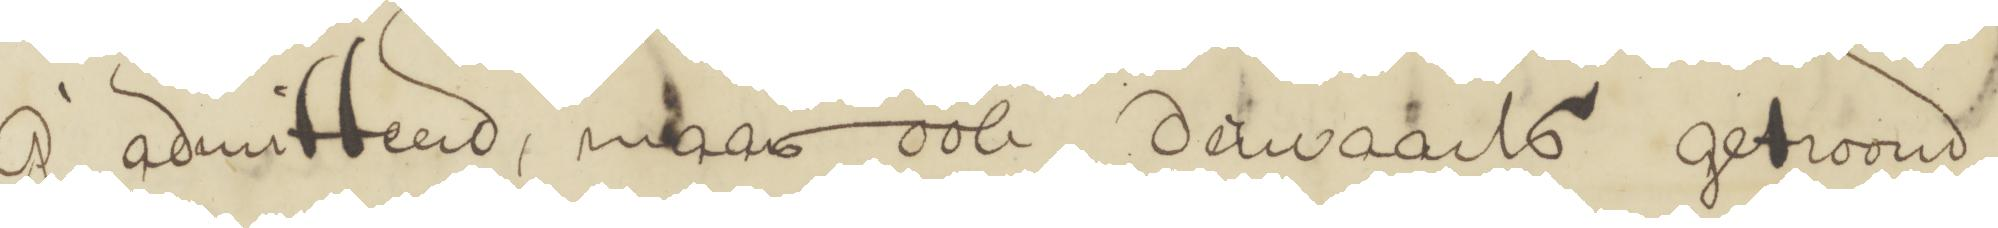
g’admitteerd, maar ook derwaarts getroond
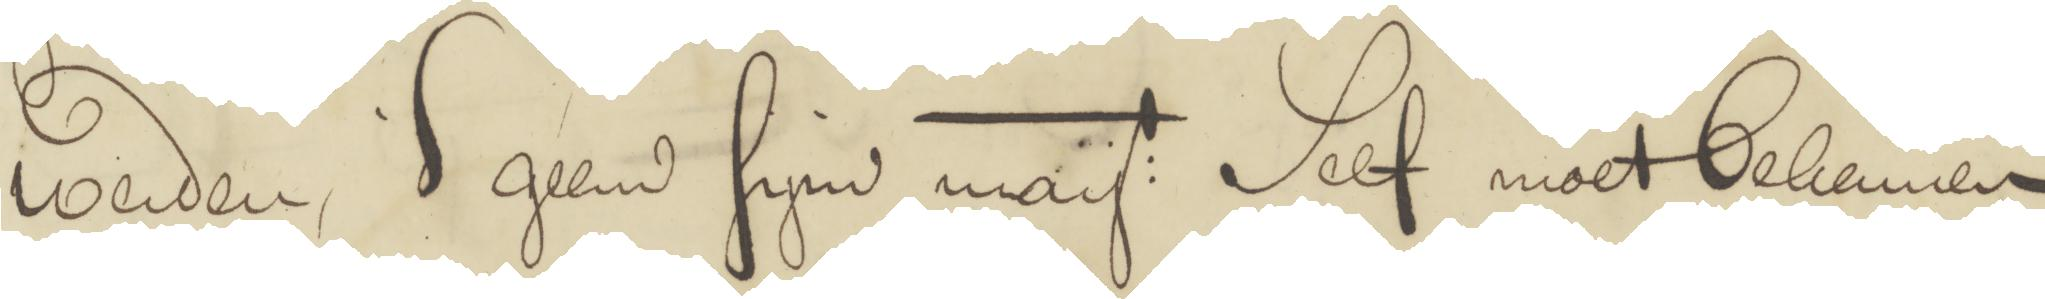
werden, ’t geene sijne maij:t self moet bekennen
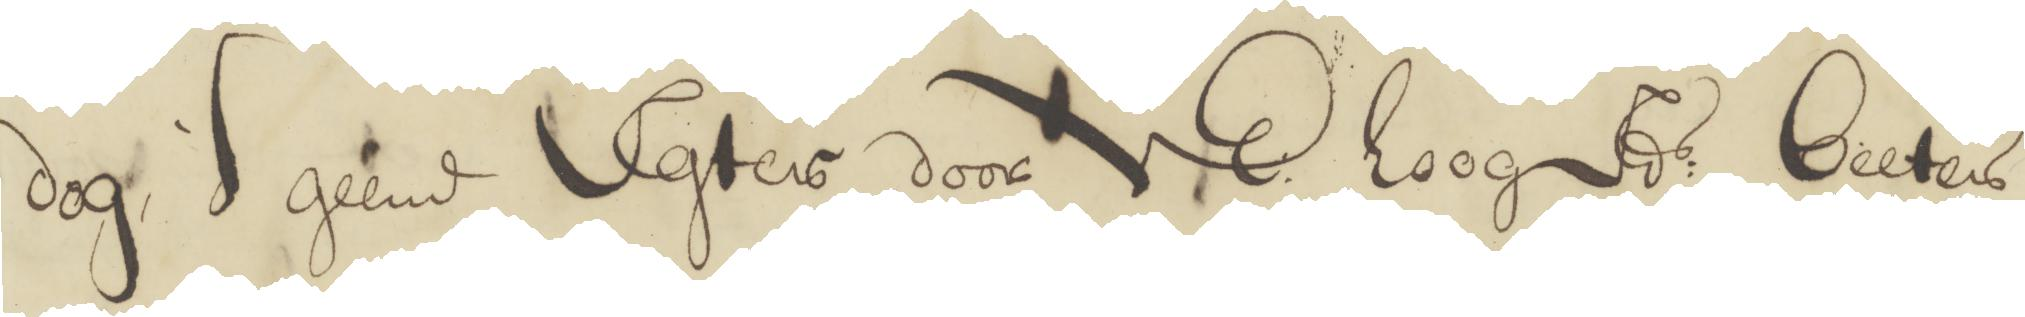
dog, ’t geene Egter door UE: hoog Ed:s beeter
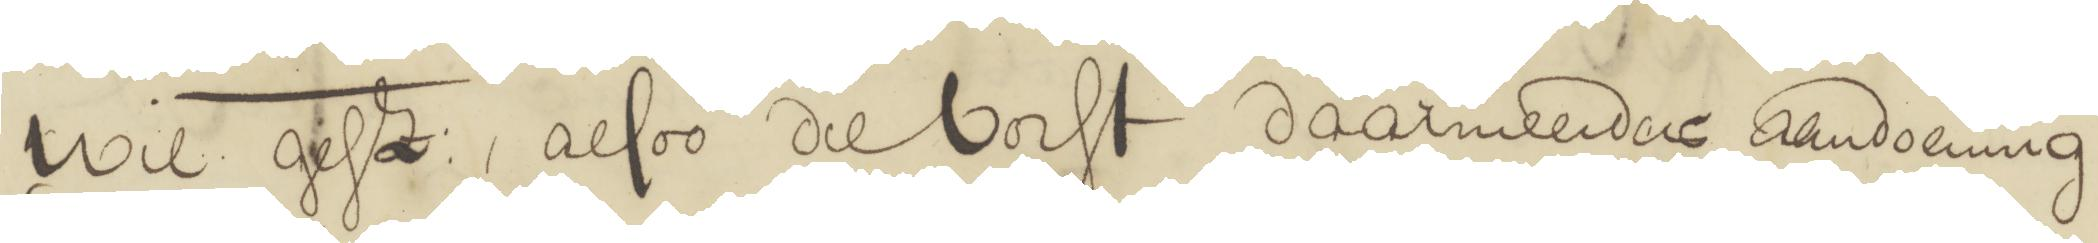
wil gesz:, alsoo die vorst daarmeerder aandoening
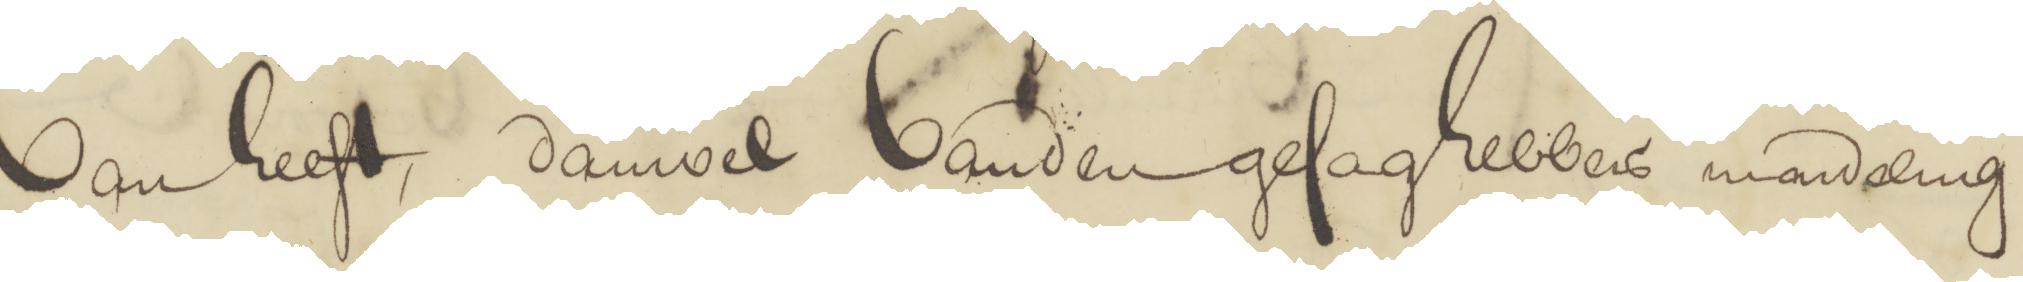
van heeft, danwel vanden gesaghebber mandeling
